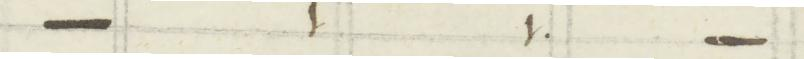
— 1 1. —
